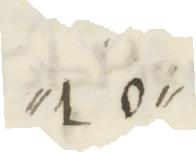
"10"
